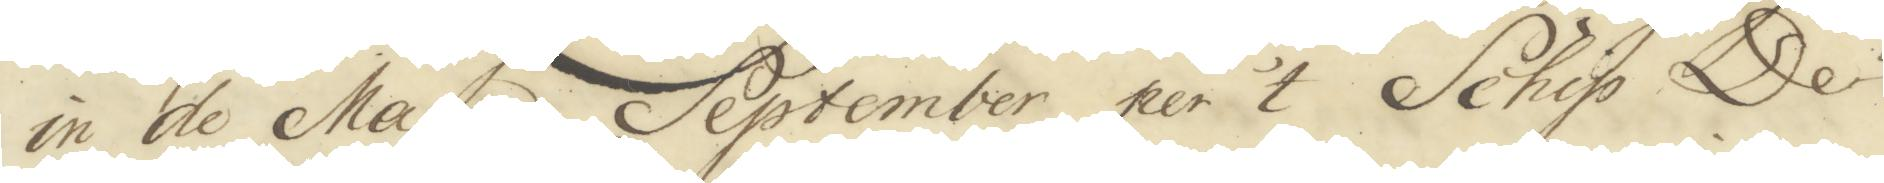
in de Maand September per ’t Schip De
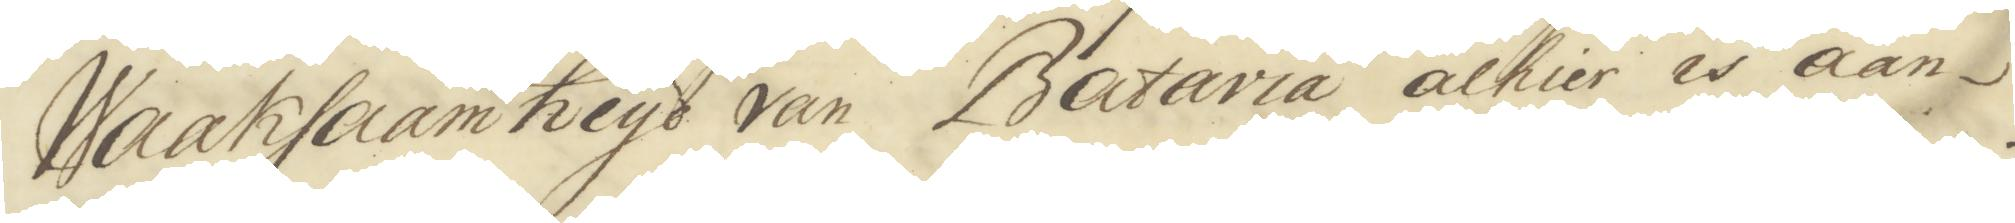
Waaksaamheyd van Batavia alhier is aan-
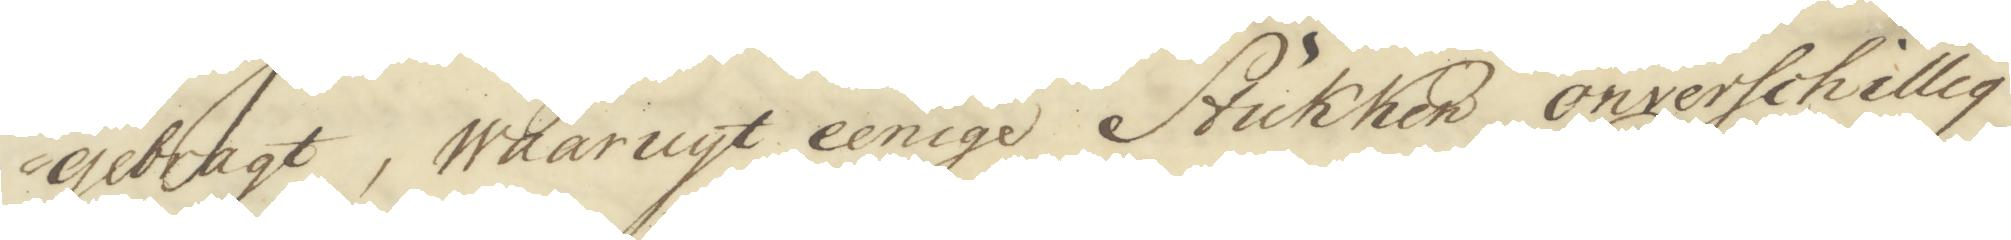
=gebragt, waaruyt eenige stukken onverschillig
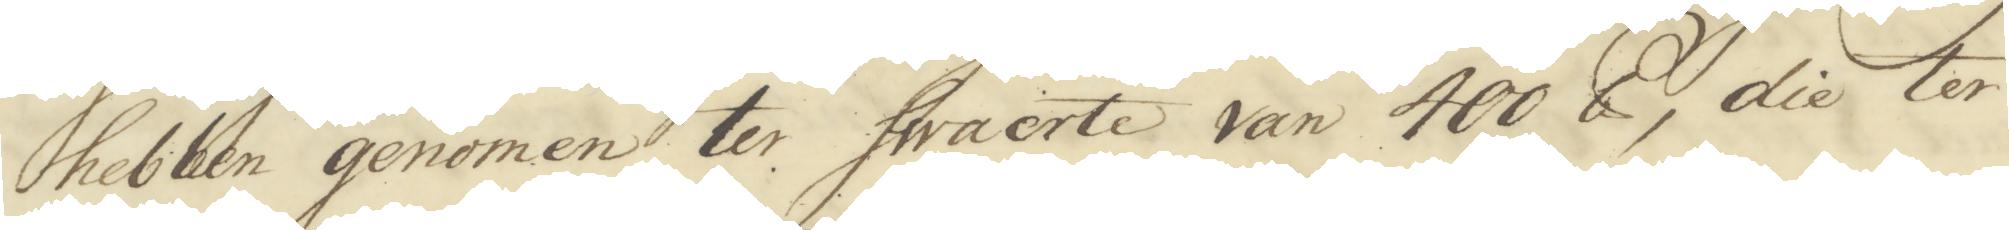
hebben genomen ter swaerte van 400 lb, die ter
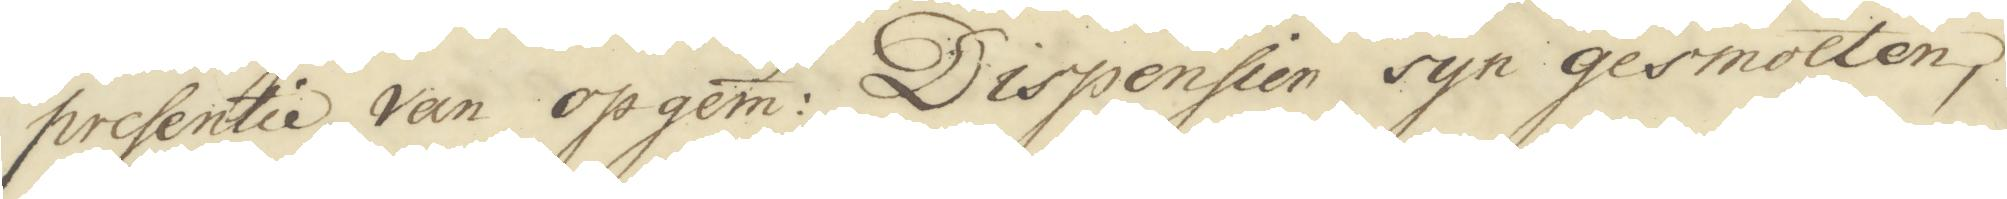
presentie van opgem: Dispensien syn gesmolten,
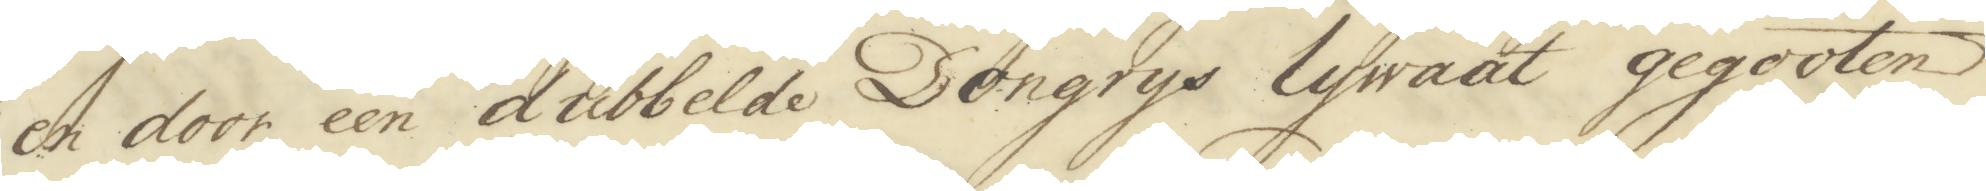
en door een dubbelde Dongrys lywaat gegooten
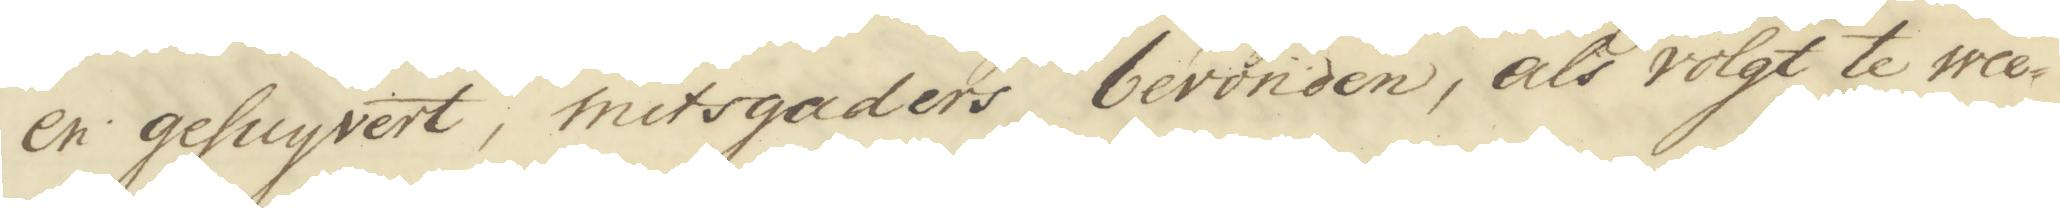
en gesuyvert, mitsgaders bevonden, als volgt te wee=
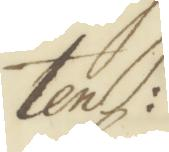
ten:
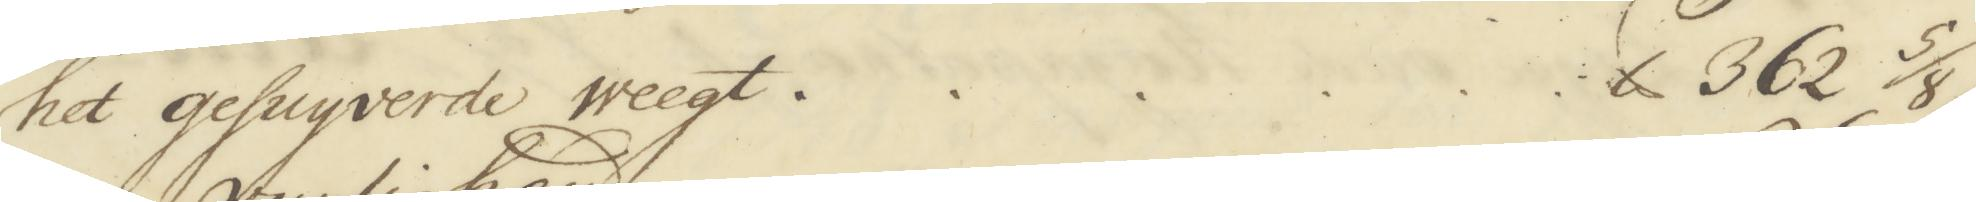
het gesuyverde weegt . . . . . . lb 362 5/8
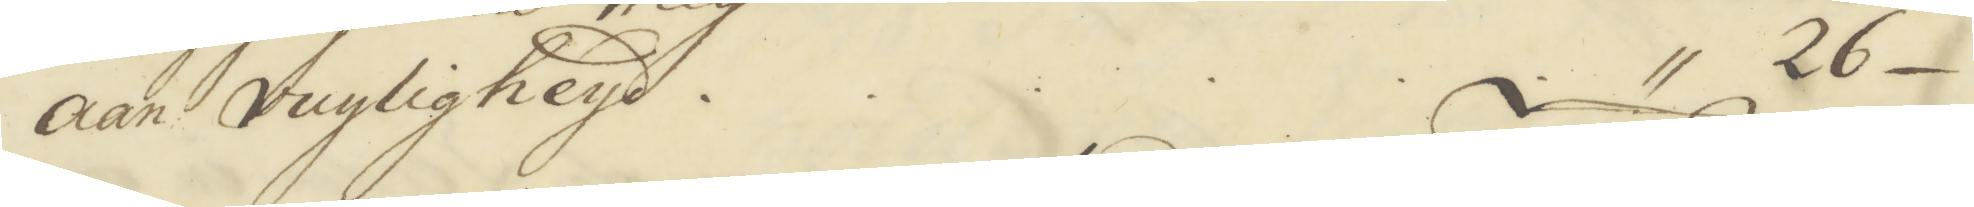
aan vuyligheijd . . . . . . „ 26 —
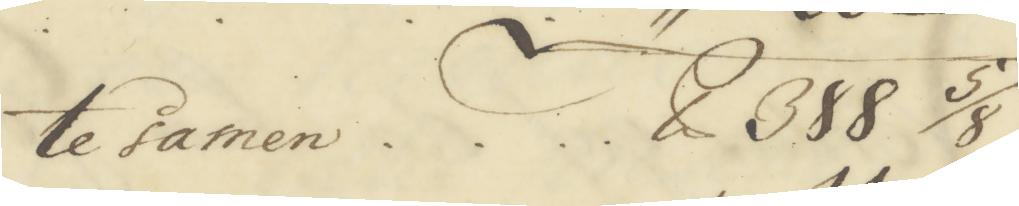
te samen . . . . lb 388 5/8
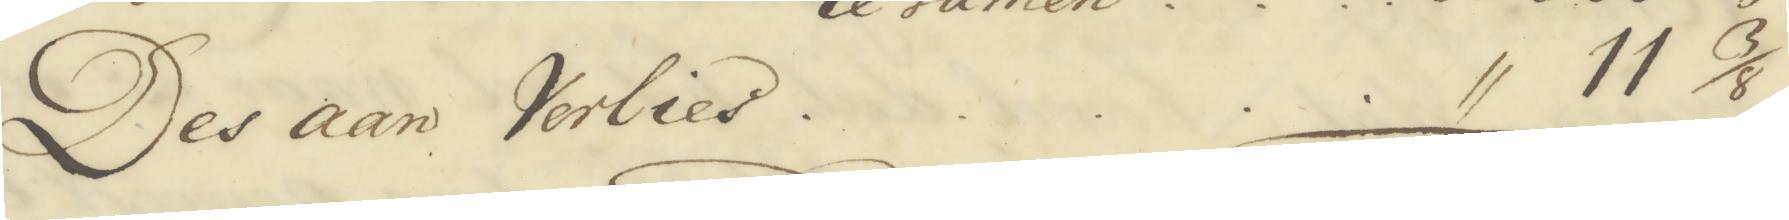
Des aan Verlies . . . . . „ 11 3/8
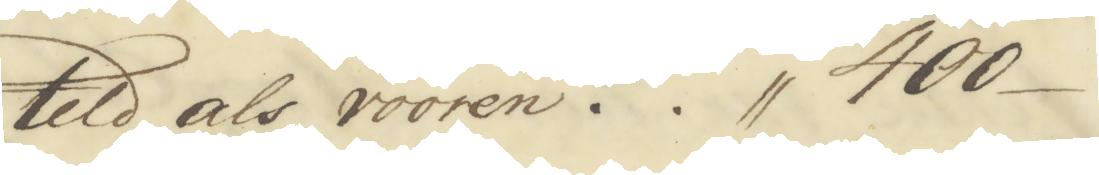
teld als vooren . . „ 400 —
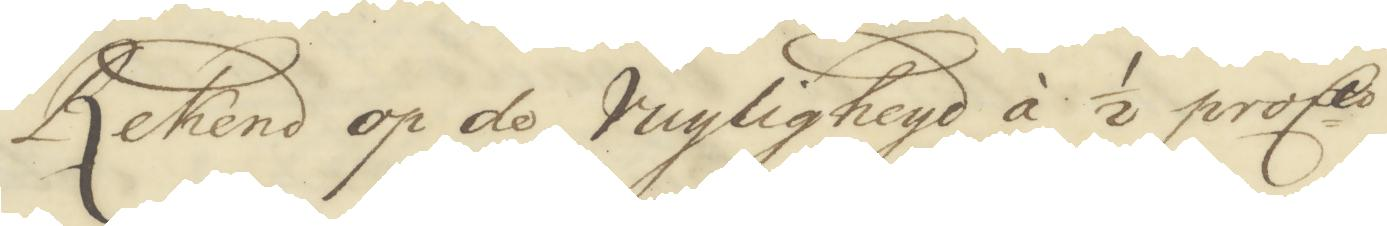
Rekend op de vuyligheijd à ½ proc=to
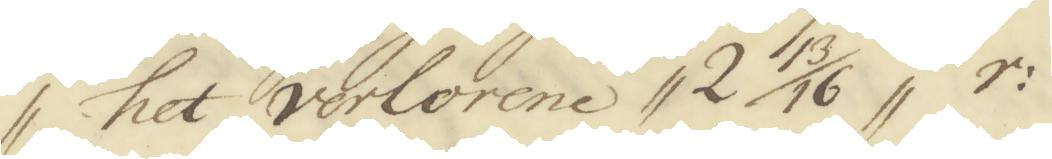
„ het verlorene „ 2 13/16 „ r:
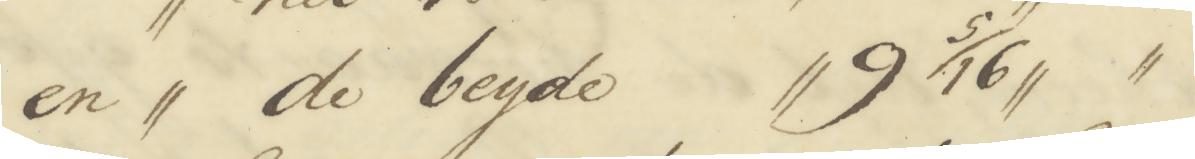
en „ de beyde „ 9 5/16 „ „
